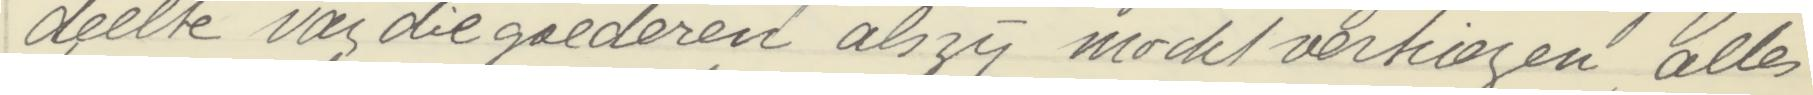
deelte van die goederen als zij mocht verkiezen, alles
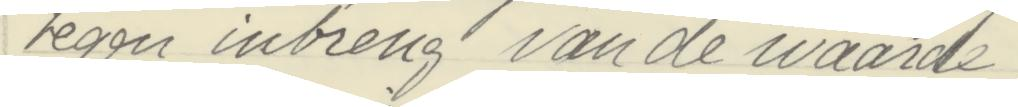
tegen inbreng van de waarde
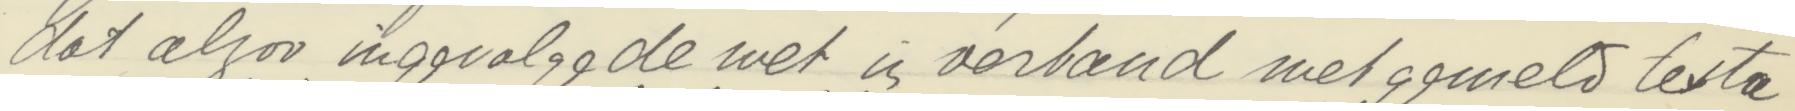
dat alzoo ingevolge de wet in verband met gemeld testa
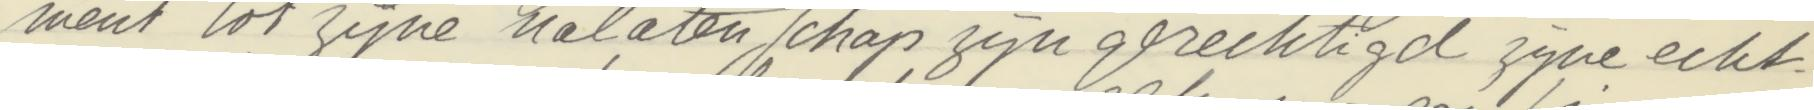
ment tot zijne nalatenschap zijn gerechtigd zijne echt
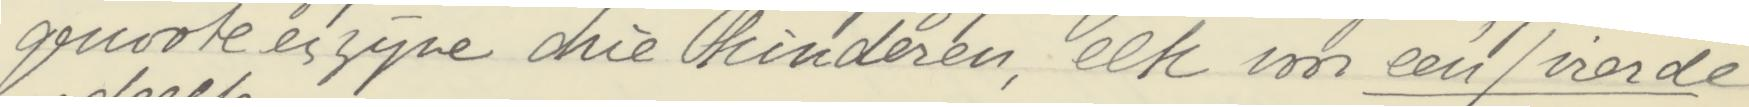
genoote en zijne drie kinderen, elk voor een / vierde
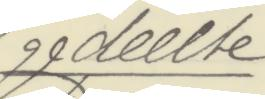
gedeelte
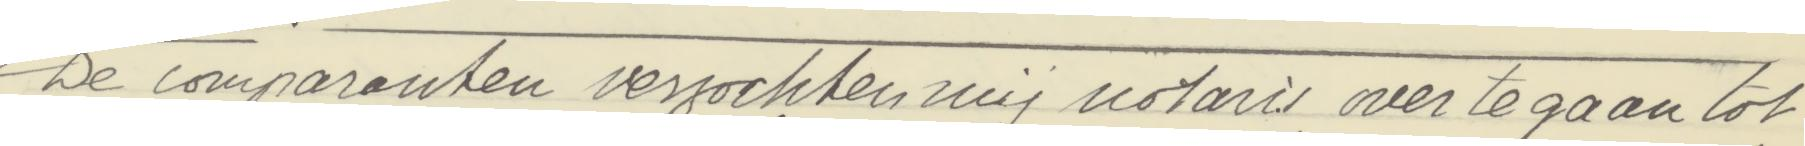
De comparanten verzochten mij notaris over te gaan tot
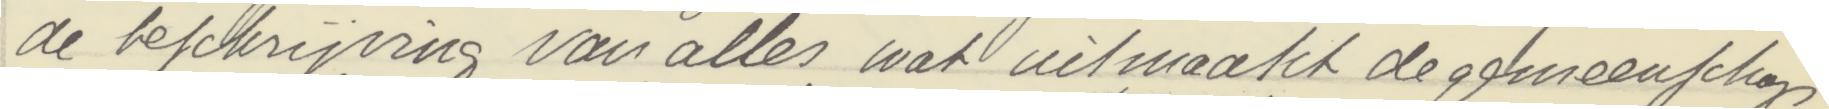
de beschrijving van alles wat uitmaakt de gemeenschap
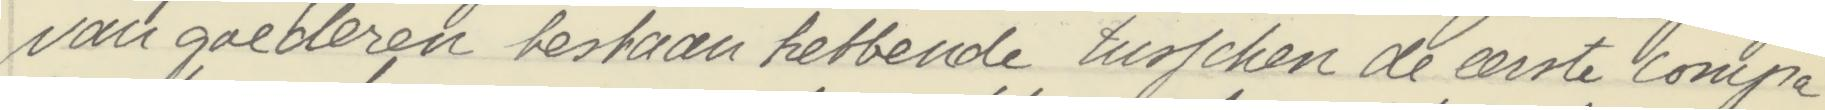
van goederen bestaan hebbende tusschen de eerste compa
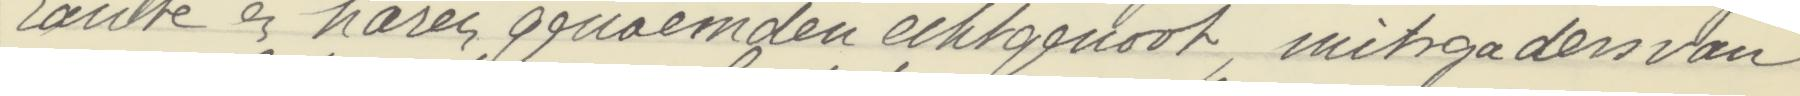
rante en haren genoemden echtgenoot, mitsgaders van
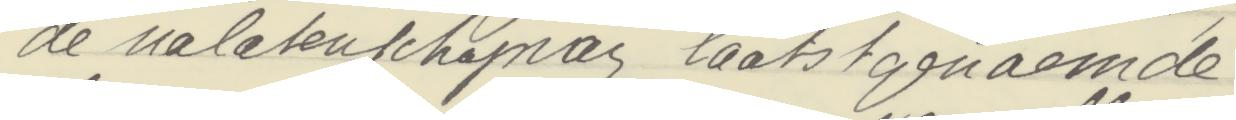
de nalatenschap van laatstgenoemde
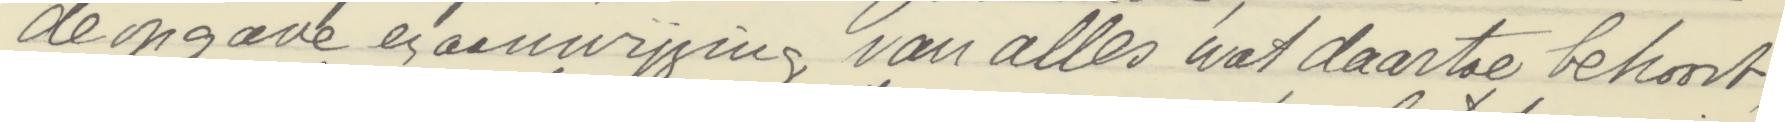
de opgave en aanwijzing van alles wat daartoe behoort
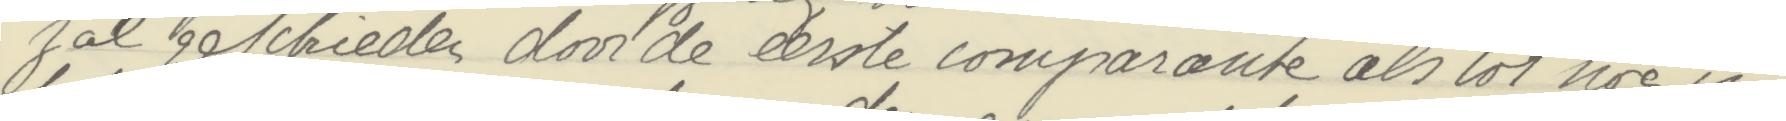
zal geschieden door de eerste comparante als tot nog in
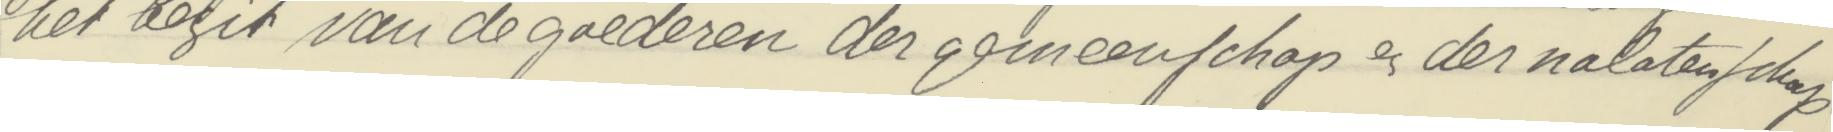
het bezit van de goederen der gemeenschap en der nalatenschap
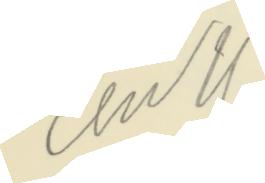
Een Y
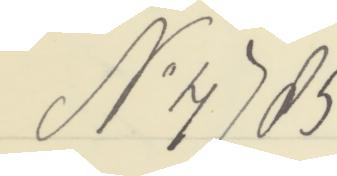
No 4785
